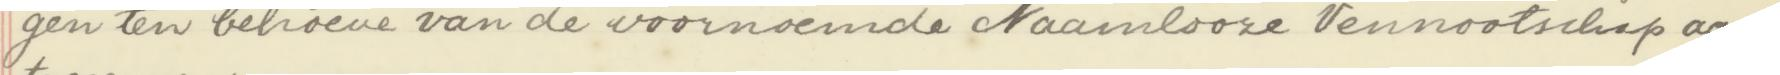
gen ten behoeve van de voornoemde Naamlooze vennootschap aan
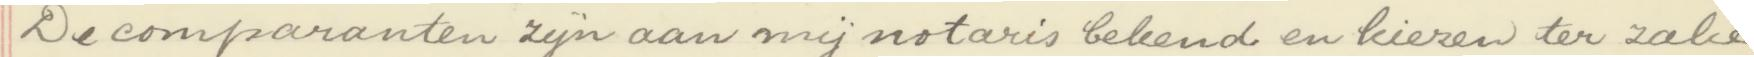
De comparanten zijn aan mij notaris bekend en kiezen ter zake
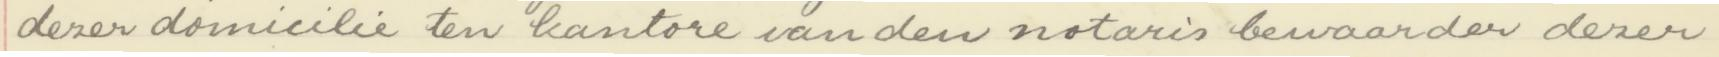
dezer domicilie ten kantore van den notaris bewaarder dezer
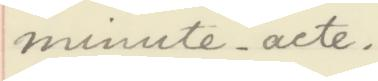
minute - acte
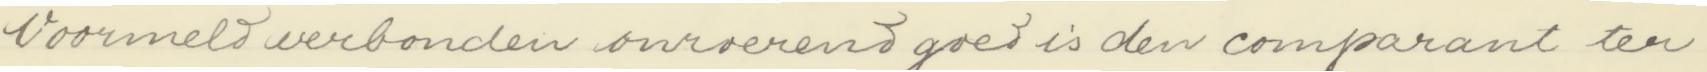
Voormeld verbonden onroerend goed is den comparant ter
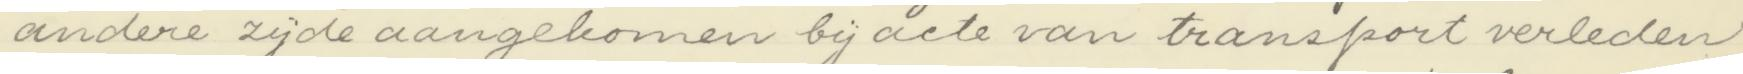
andere zijde aangekomen bij acte van transport verleden
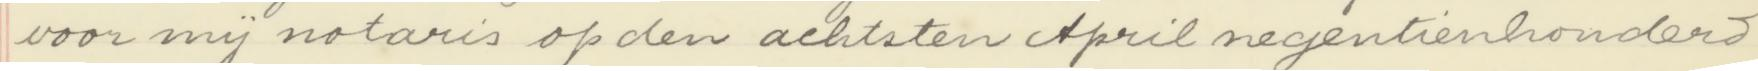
voor mij notaris op den achtsten April negentienhonderd
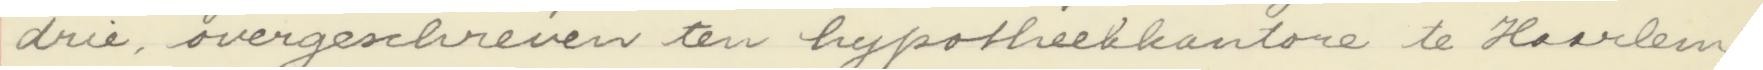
drie, overgeschreven ten hypotheekkantore te Haarlem
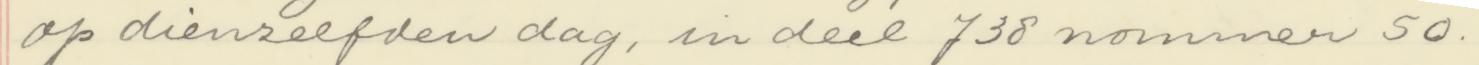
op dienzelfden dag, in deel 738 nommer 50.
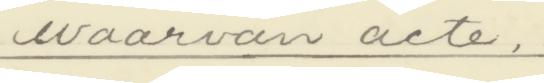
waarvan acte,
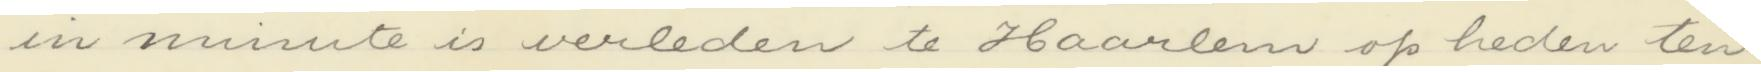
in minute is verleden te Haarlem op heden ten
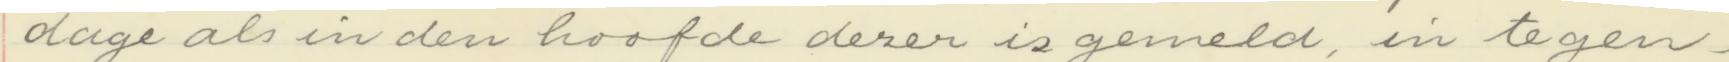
dage als in den hoofde dezer is gemeld, in tegen
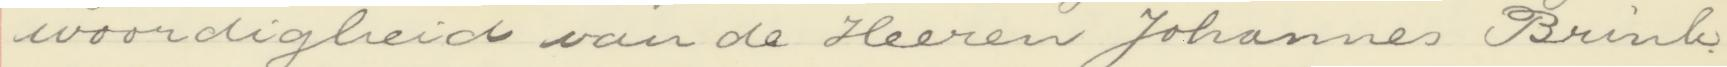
woordigheid van de Heeren Johannes Brink
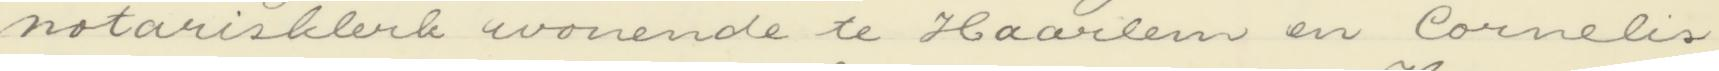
notarisklerk wonende te Haarlem en Cornelis
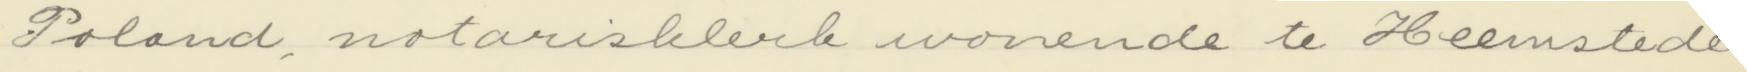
Poland, notarisklerk wonende te Heemstede
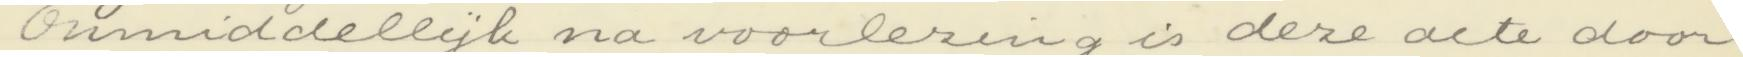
Onmiddellijk na voorlezing is deze acte door
